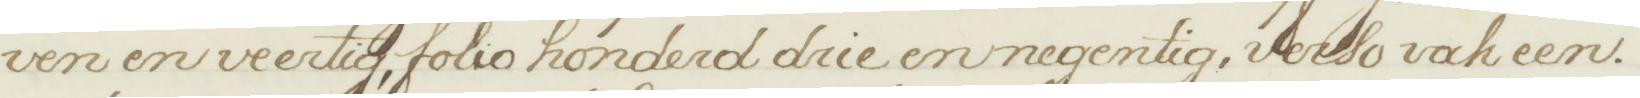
ven en veertig, folio honderd drie en negentig, verso vak een.
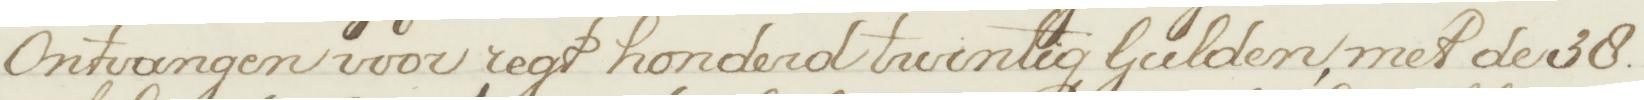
Ontvangen voor regt honderd twintig Gulden, met de 38.
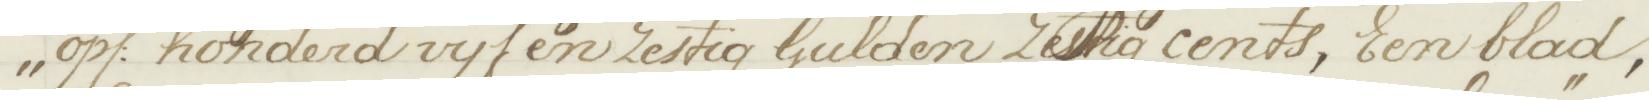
„opC: honderd vyf en zestig Gulden zestig cents, Een blad,
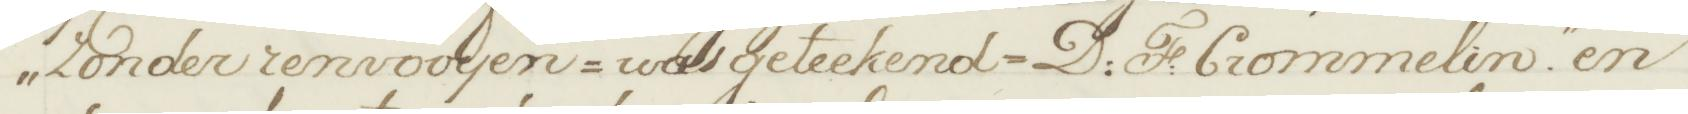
„zonder renvooyen = was geteekend = D: F: Crommelin." en
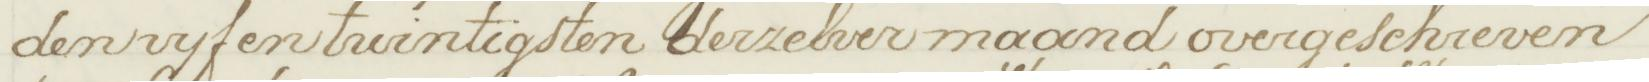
den vyf en twintigsten derzelver maand overgeschreven
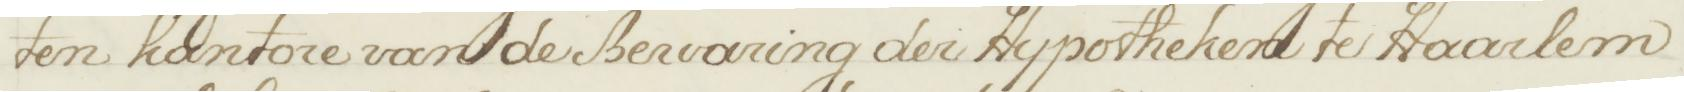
ten kantore van de Bewaring der Hypotheken te Haarlem
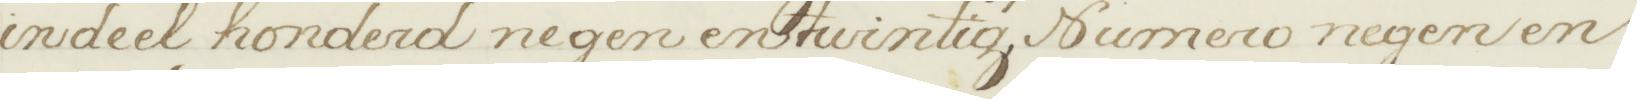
in deel honderd negen en twintig, Numero negen en
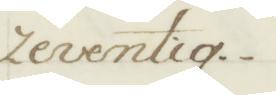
zeventig.-
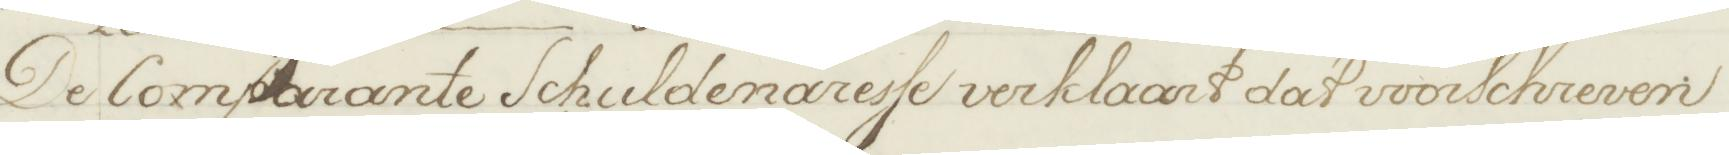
De Comparante Schuldenaresse verklaart dat voorschreven
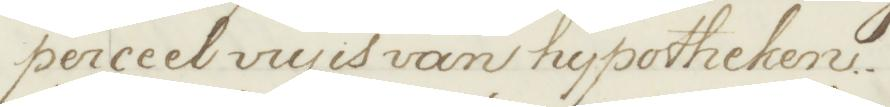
perceel vry is van hypotheken.-
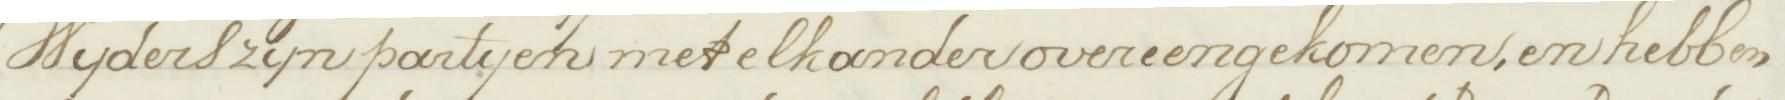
Wyders zyn partyen met elkander overeengekomen, en hebben
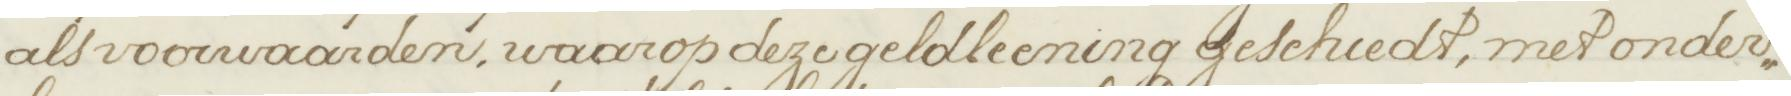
als voorwaarden, waarop deze geldleening geschiedt, met onder„
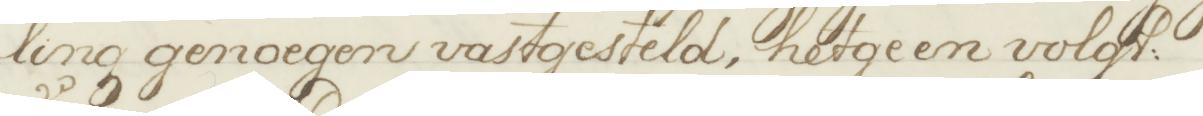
ling genoegen vastgesteld, hetgeen volgt:
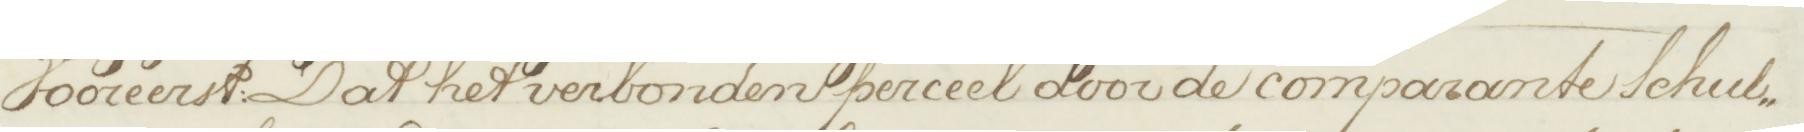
Vooreerst: Dat het verbonden perceel door de comparante schul„
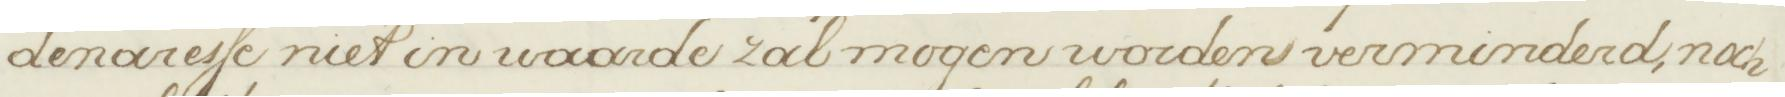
dendresse niet in waarde zal mogen worden verminderd, noch
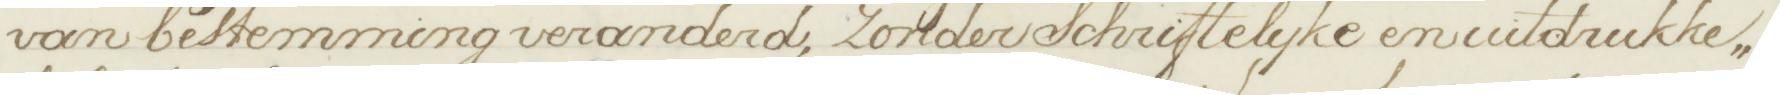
van bestemming veranderd, zonder schriftelyke en uitdrukke„
